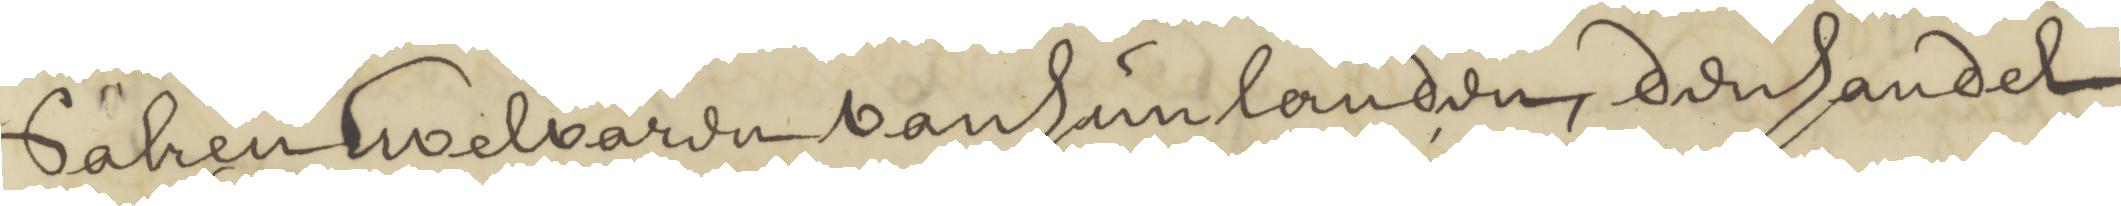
saken 'twelvaren van hun handen, den handel
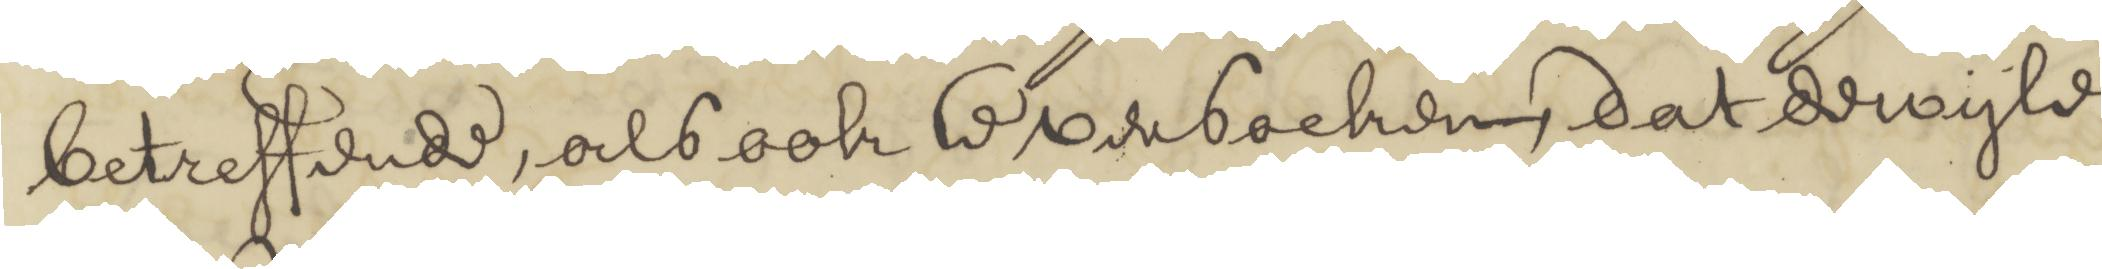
betreffende, als ook te versoeken, dat dewijle
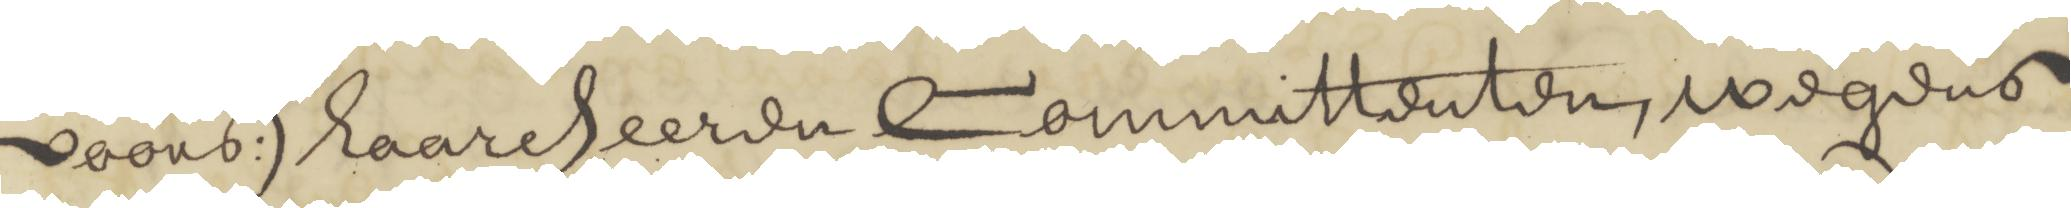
voors:) haare heeren Committenten, wegens
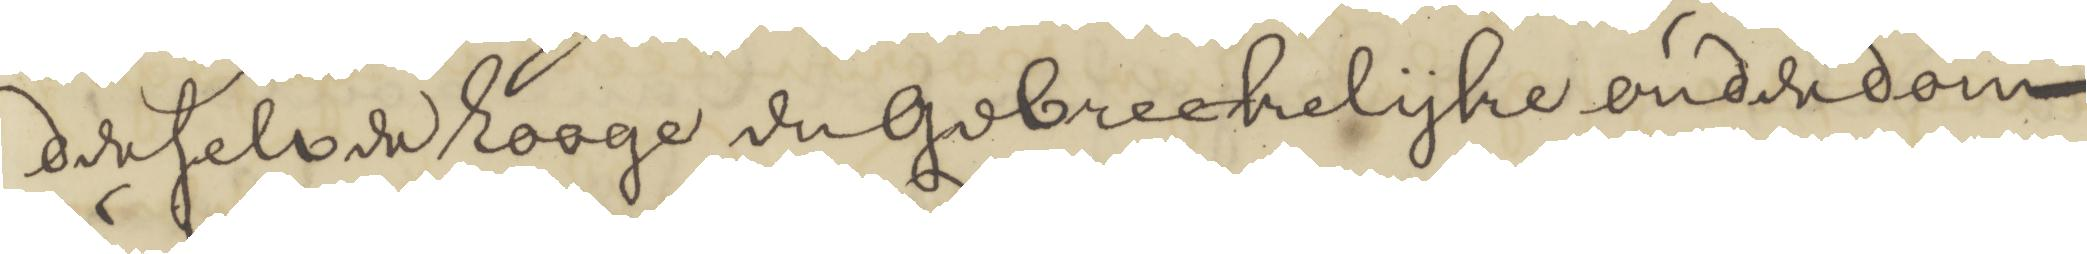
derselver hooge en gebreckelijke ouderdom
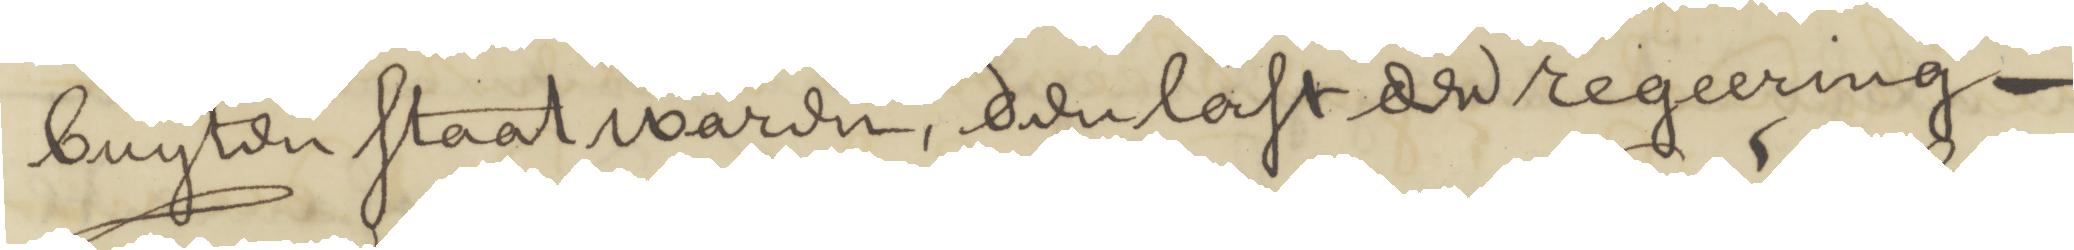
buyten staat waren, den last der regeering
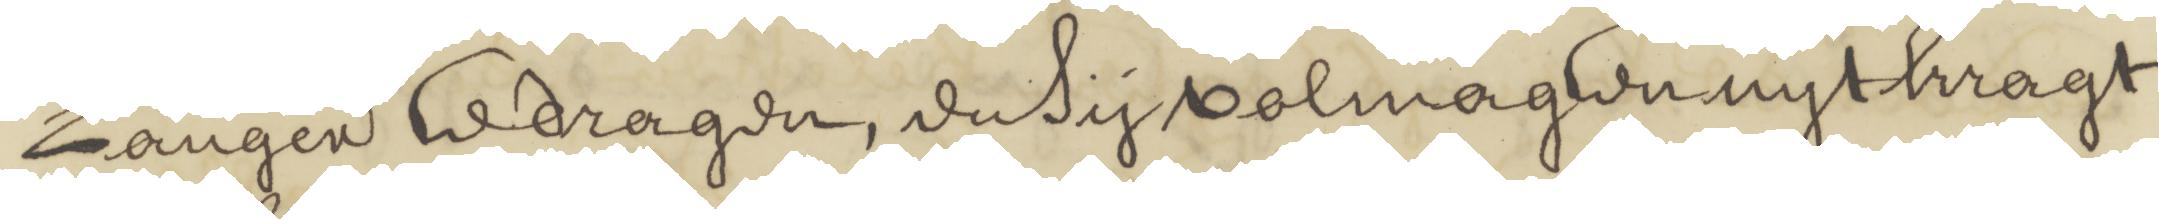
Langer te dragen, en sij volmagten uijt kragt
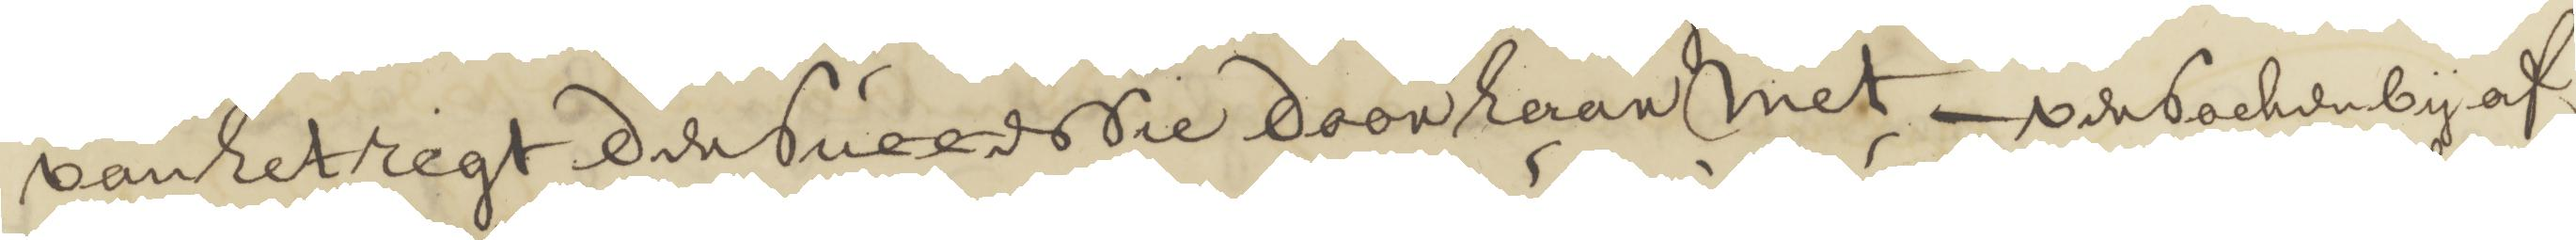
van het regt der successie door haar met versoek en bij af
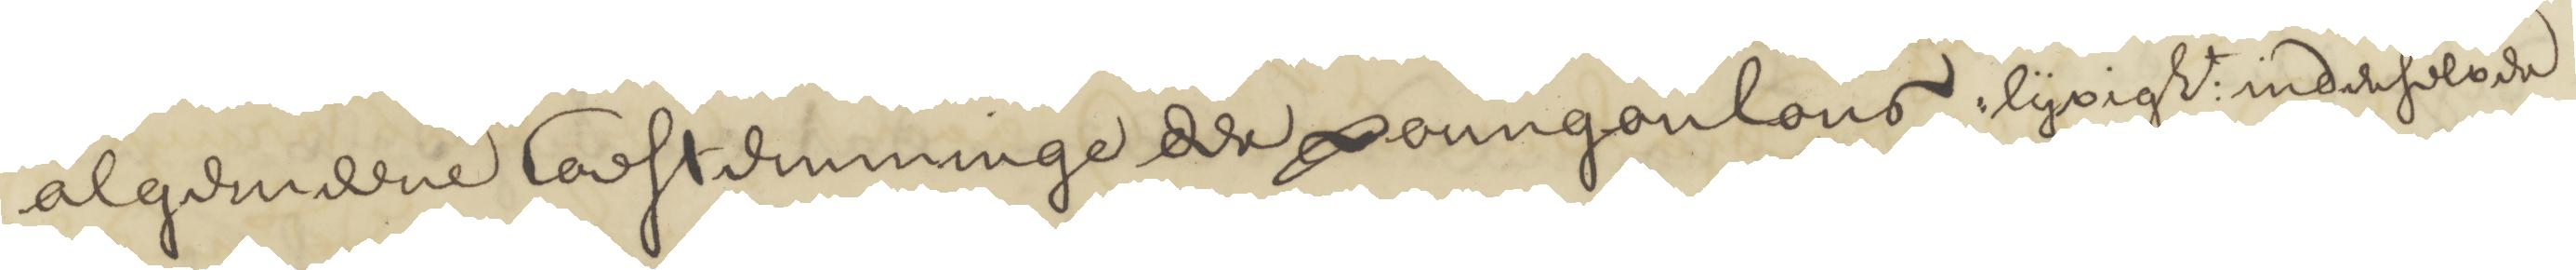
algemeene toestemminge der poungoulous „lijvigh:t in derselver
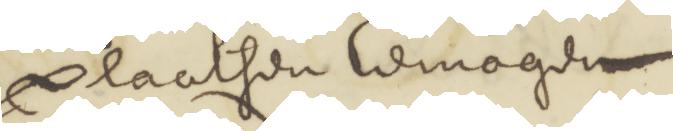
plaatsen te mogen
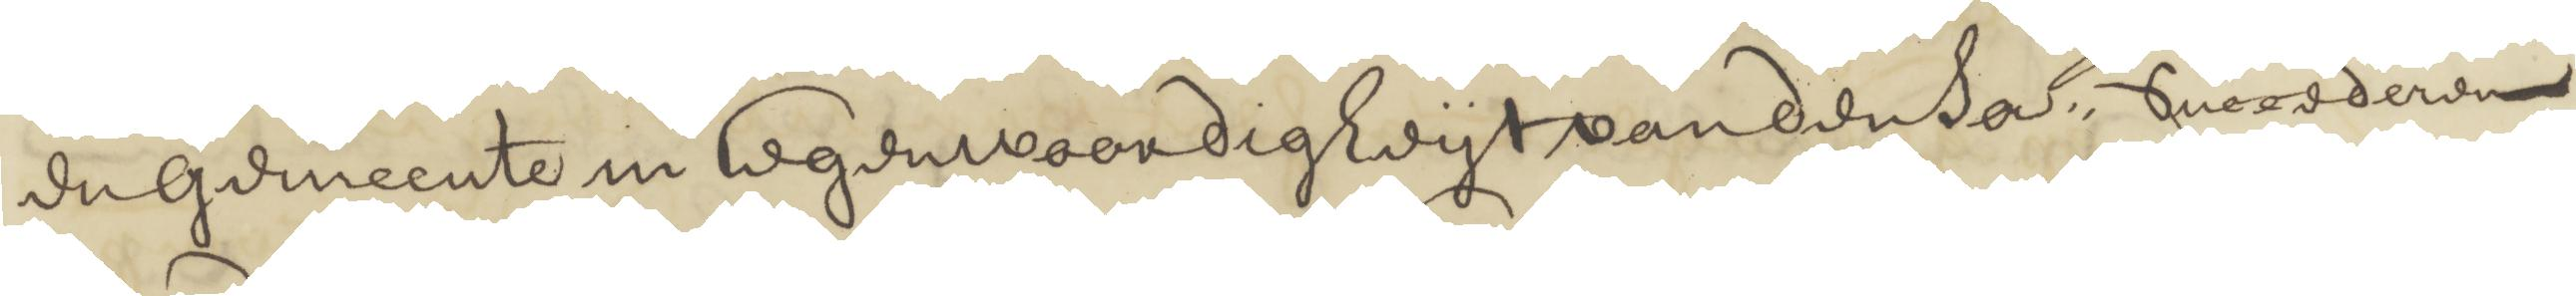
en gemeente in tegenwoordigheijt van den sa„ succesderen
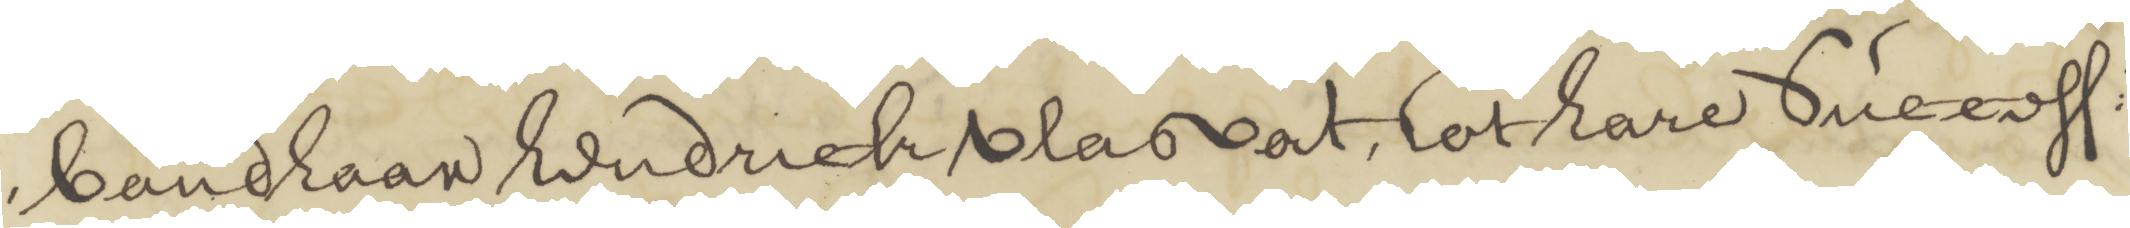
„bandhaar hendrick vlasvat, tot hare success:s
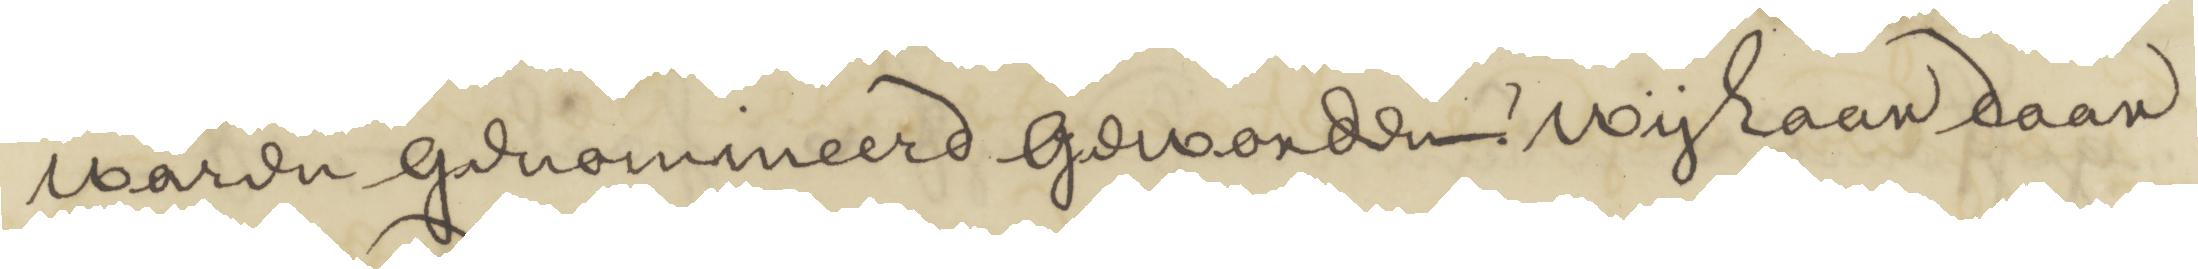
waren genomineerd geworden; wij haar daar
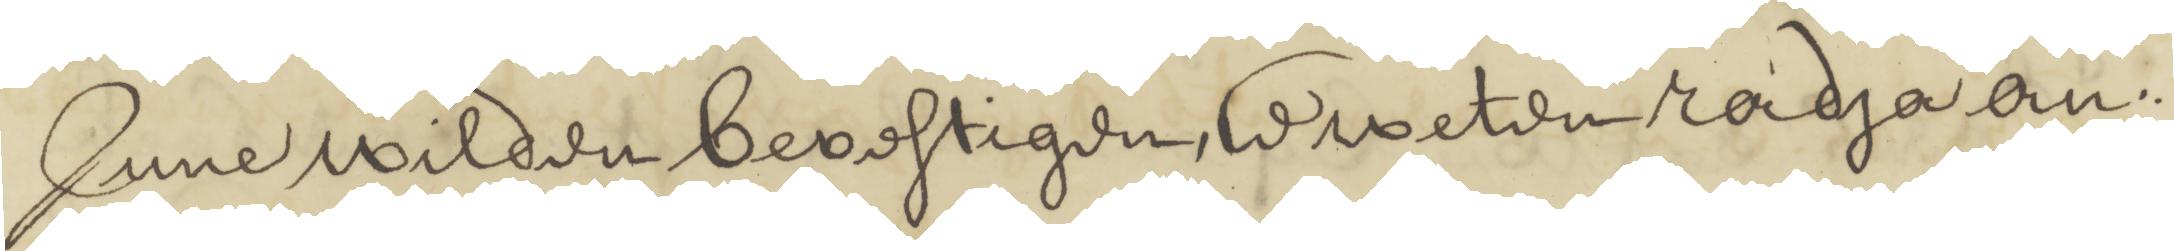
Jnne wilden bevestigen, te weten radja an„
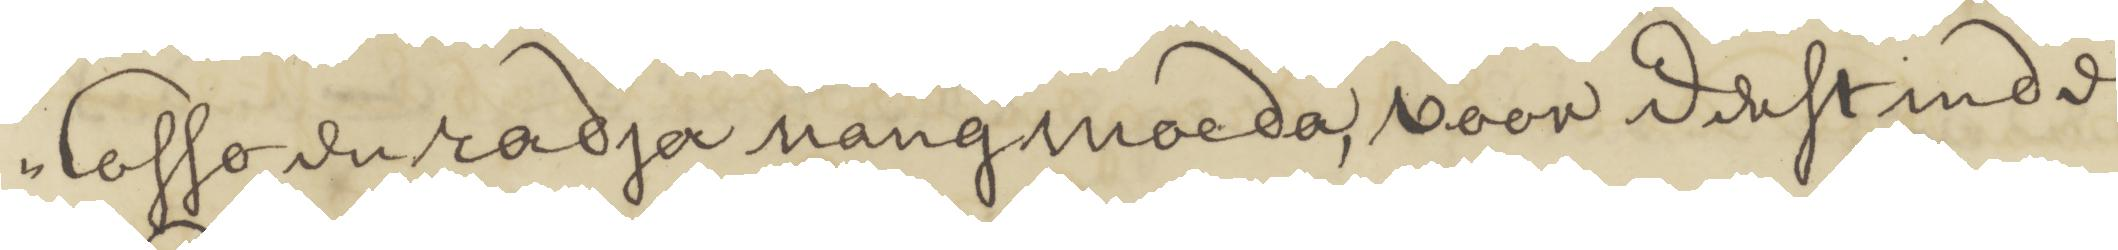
„tosso en radja nangmoeda, voor Eerst inde
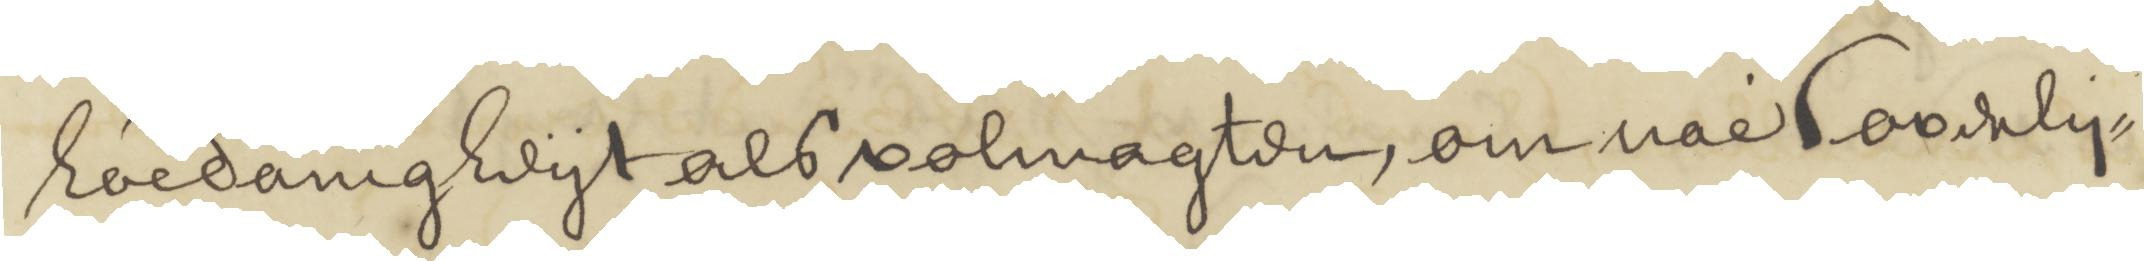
hoedanigheijt als volmagten, om nae 't overlij„
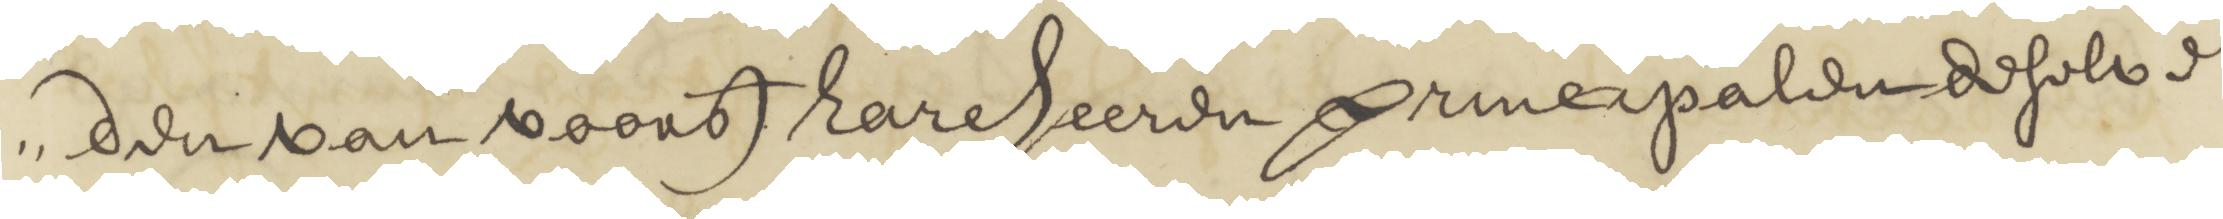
„den van voors hare heeren principalen deselve
